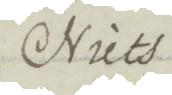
Niets
